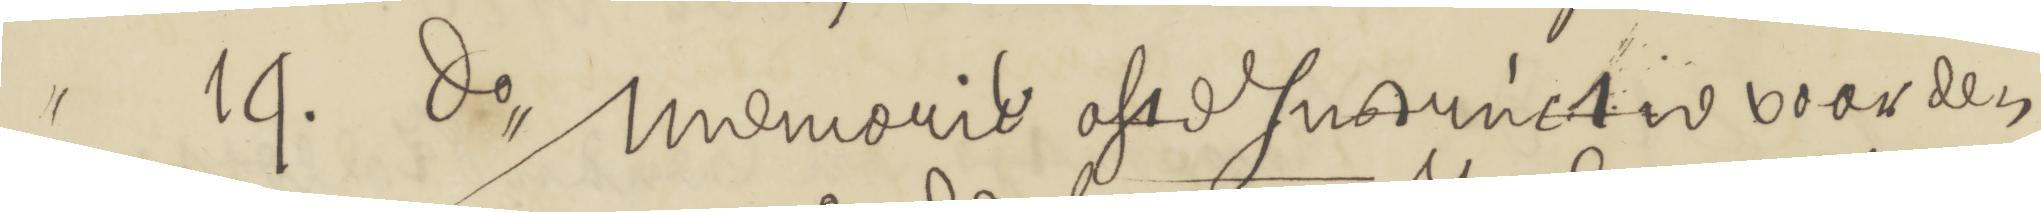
„ 14. d„o Memorie ofte Jnstructie voor den
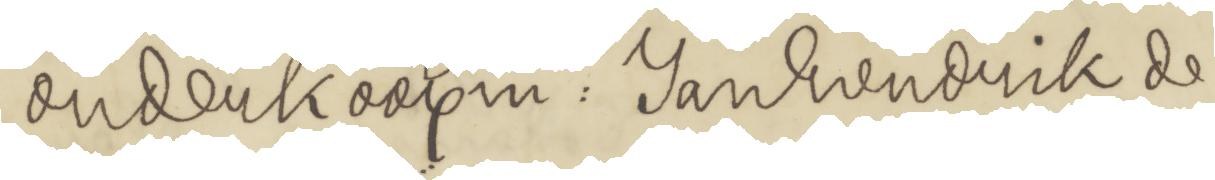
onderkoopm: Ian hendrik de
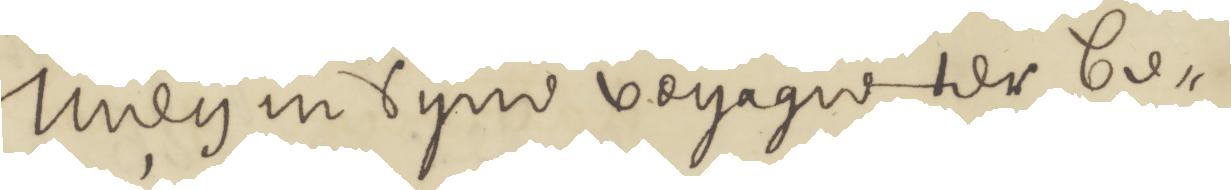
Meij in sijne voijagie ter be„
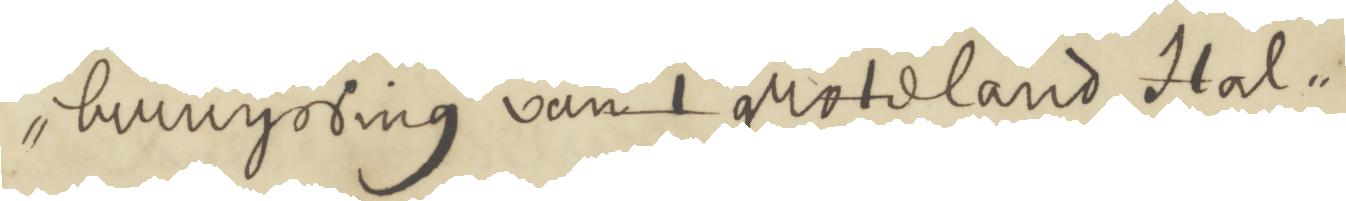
„kruijssing van 't groteland Hal„
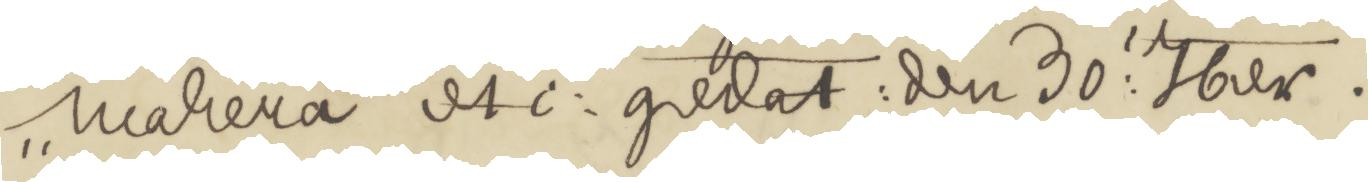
„mahera etc: gedat: den 30:' 7ber.
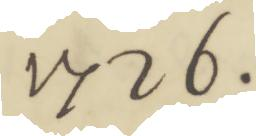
1726.
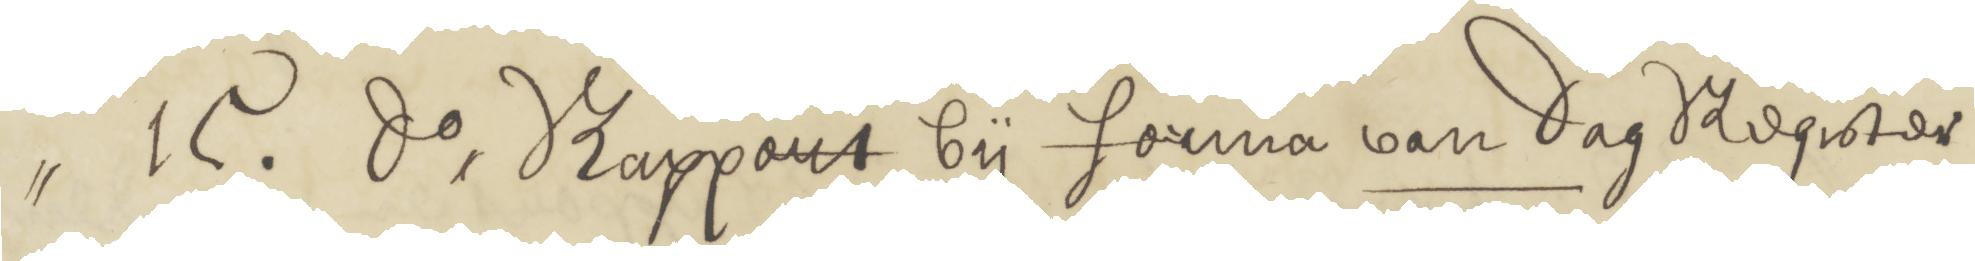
„ 15. d„o Rapport bij forma van Dag Register
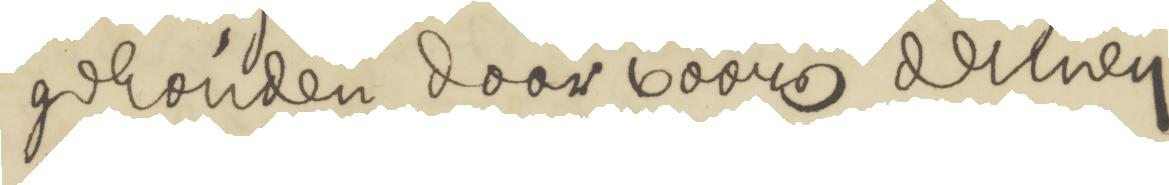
gehouden door voors de meij
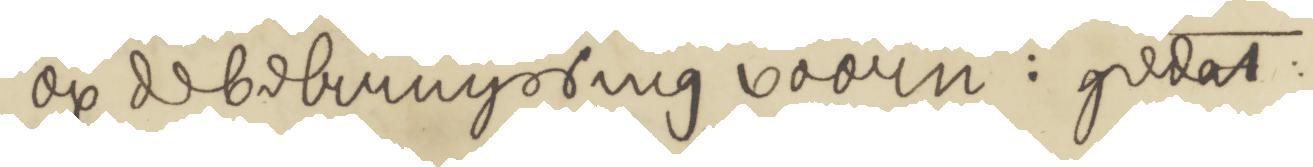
op de bekruijssing voorn:t gedat:
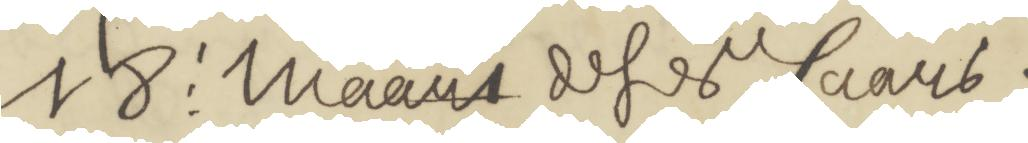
18:' maart deses Jaars.
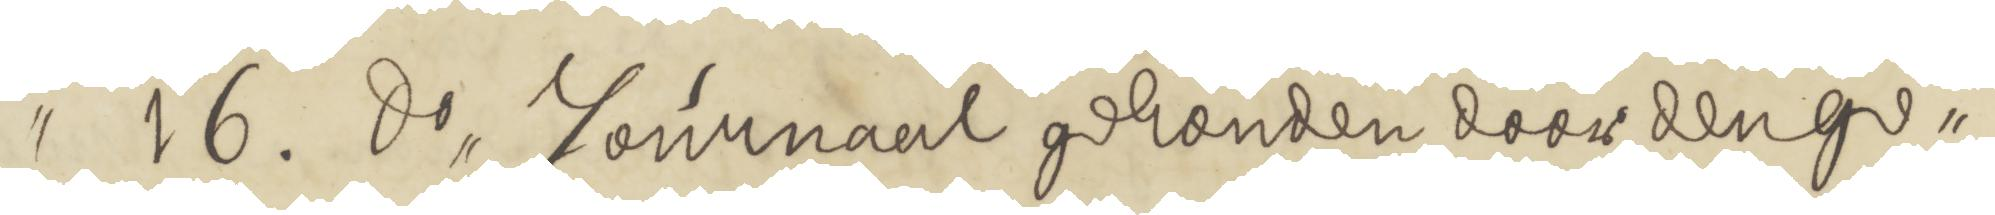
„ 16. d„o Journaal gehouden door den ge„
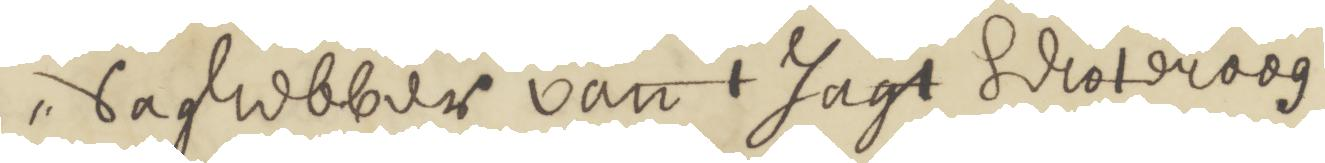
„sag hebber van ’t Jagt Schoteroog
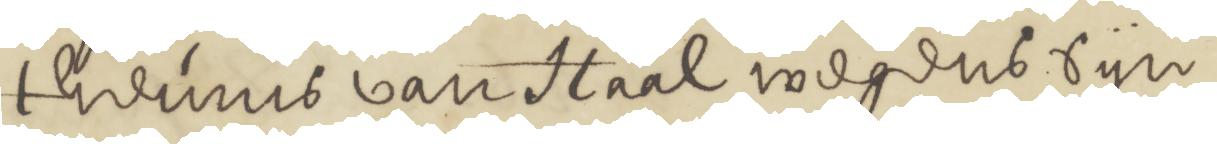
theunis van Haal wegens sijn
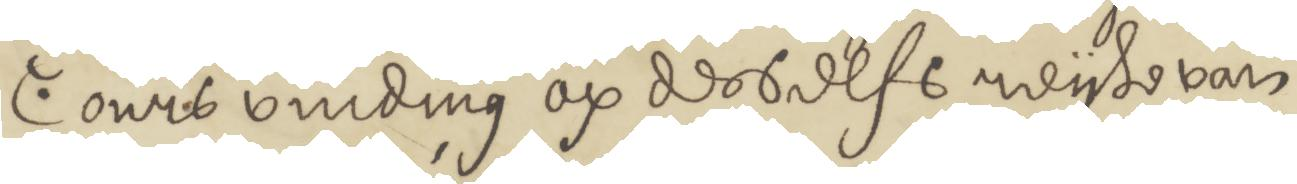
Cours vinding op desselfs reijse van
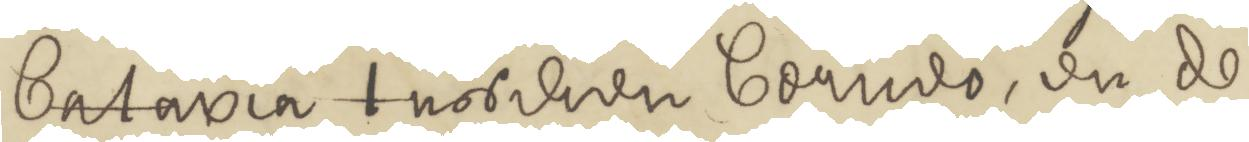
batavia tusschen borneo, en de
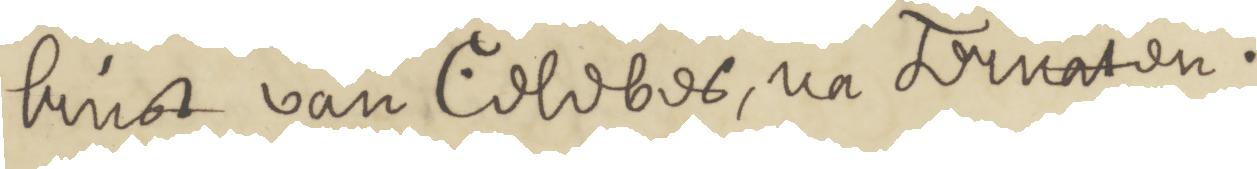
kust van Celebes, na Ternaten.
